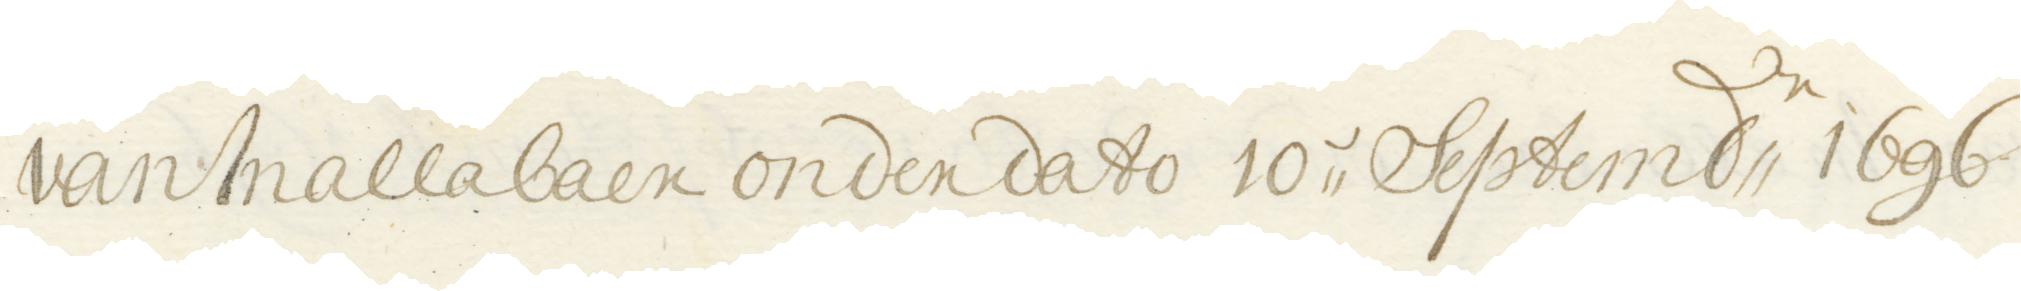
van mallabaer onder dato 10„' Septemb„r 1696
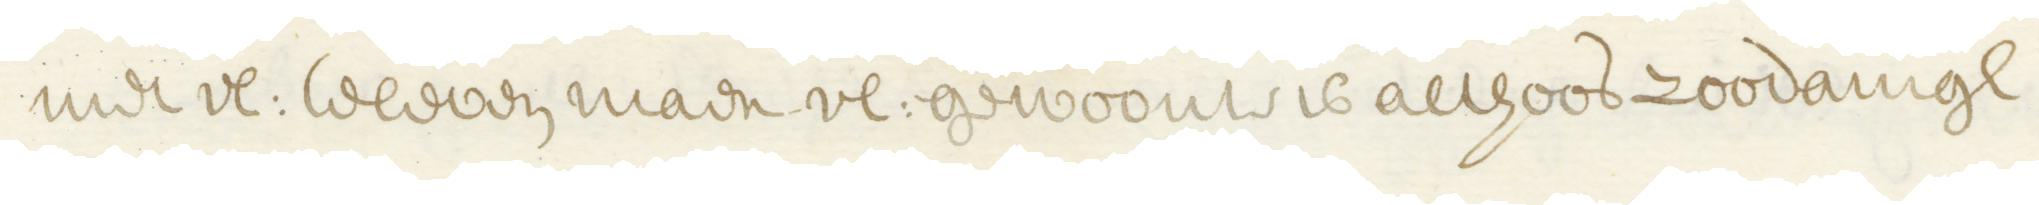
met vl: te leven maer vl: gewoonte is althoos zoodanigh
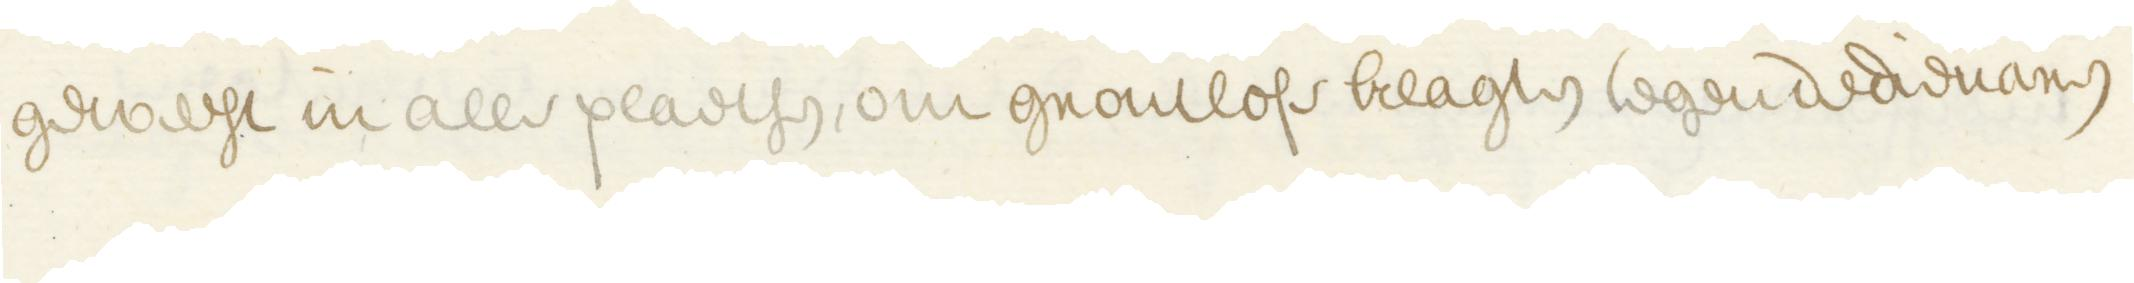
geweest in alle plaetsen, om grontlose klagten tegen de dienaren
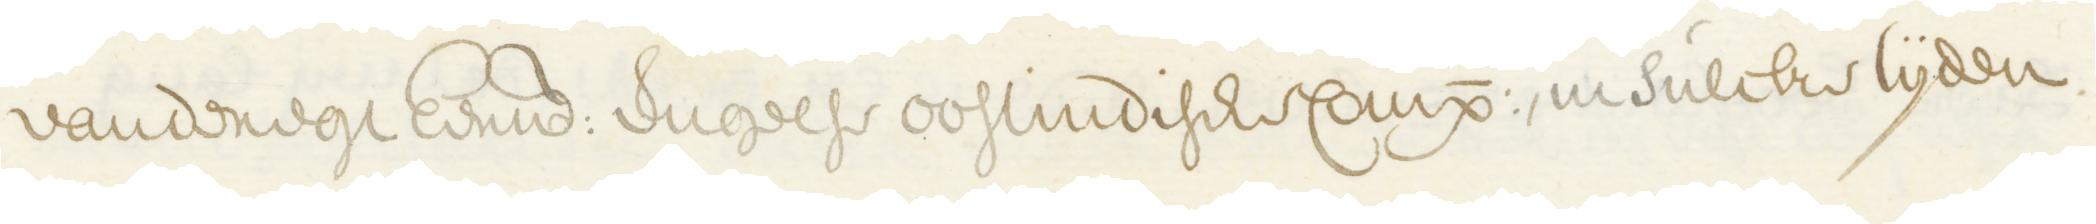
vanderegt Eerw: Engelse oostindische Comp:, in sulcke tijden.
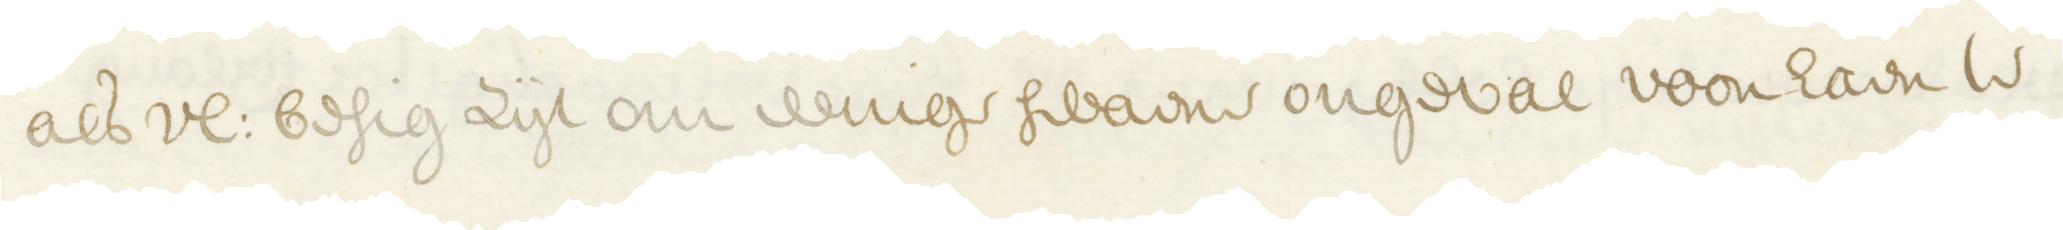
als vl: besig zijt om eenige swaere ongeval voor haer te
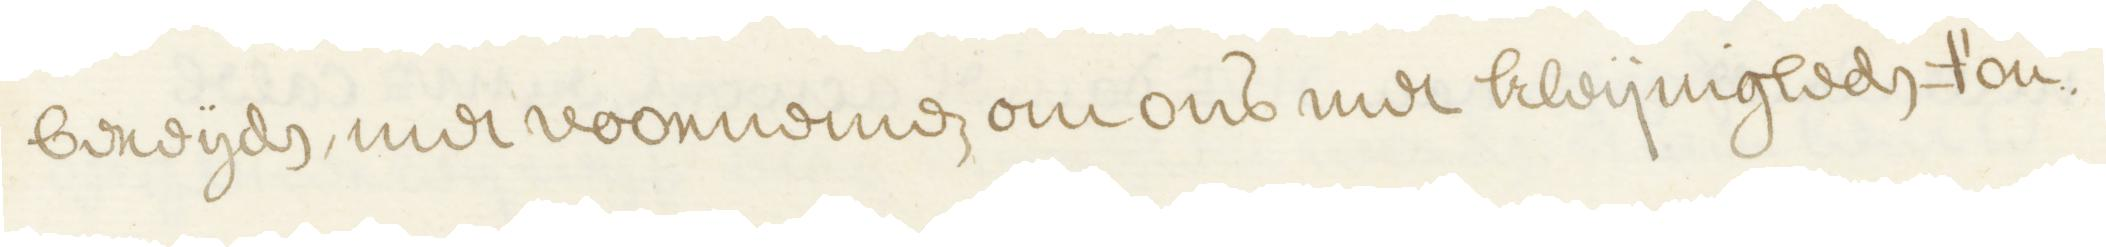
bereijden, met voornemen om ons met kleijnigheden–t'on„
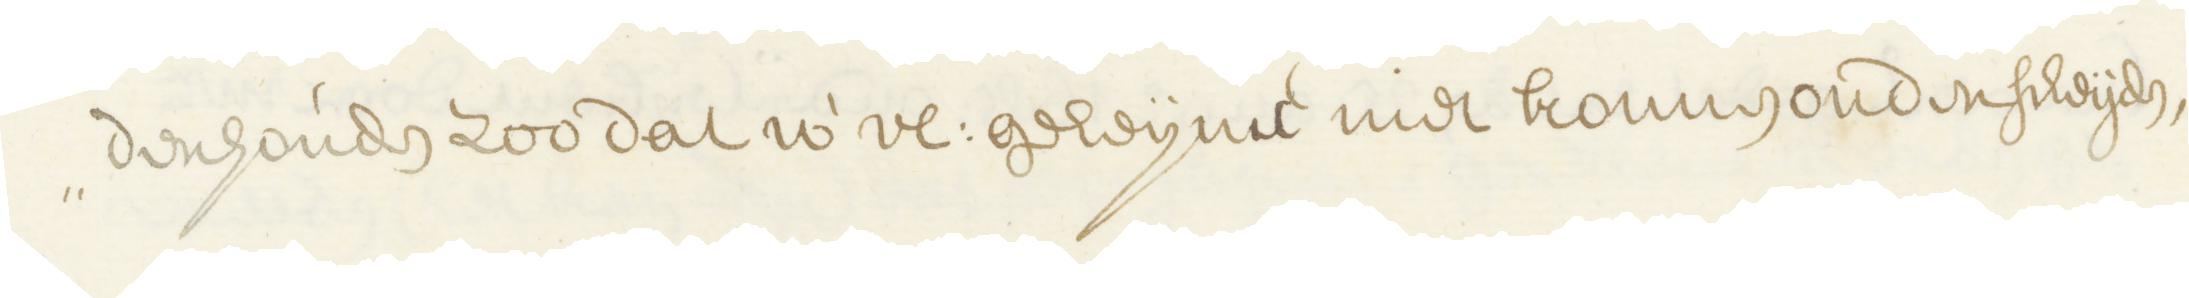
„derhouden zoo dat w' vl: geheijme niet konnen onder scheijden,
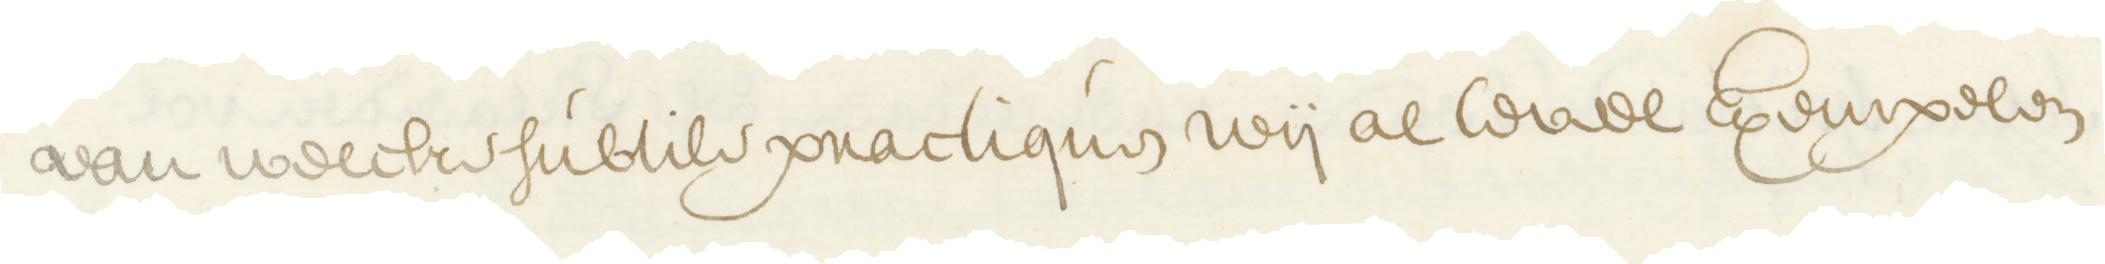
van welcke subtile practiquen wij al teveel Exempelen
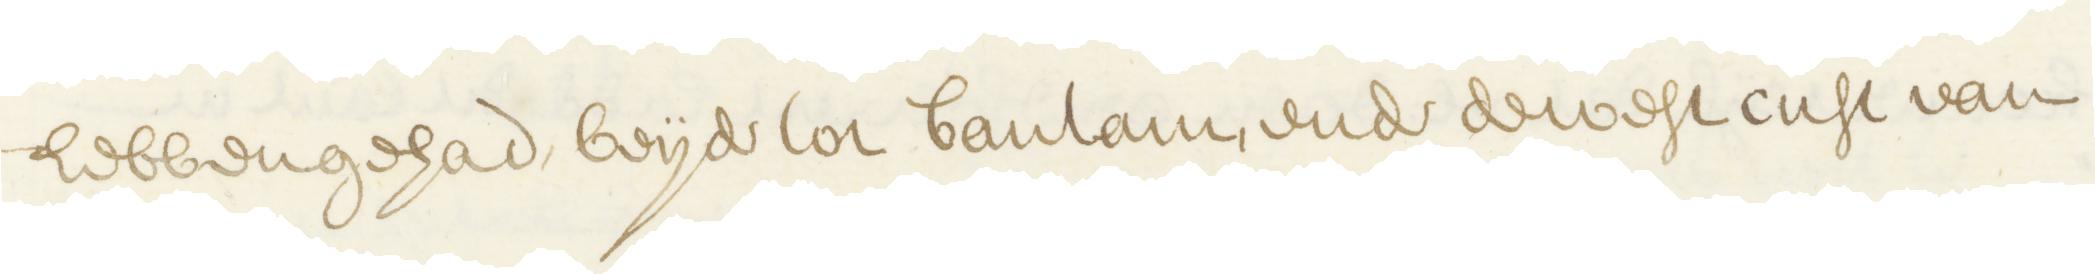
hebben gehad, beijde tot bantam, ende dewest cust van
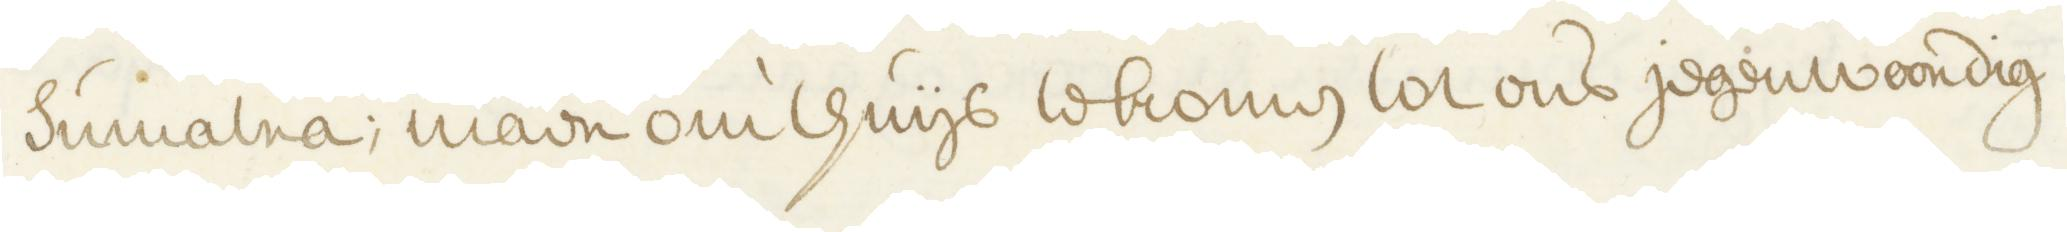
sumatra; maer om thuijs te komen tot ons jegenwoordig
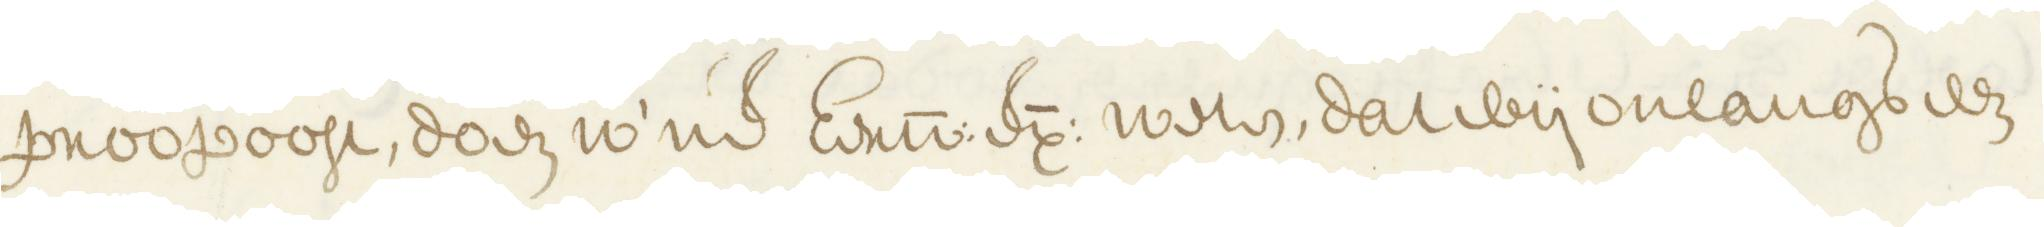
proopoost, doen w' uE Eerw: Ex: weten, dat wij onlangs een
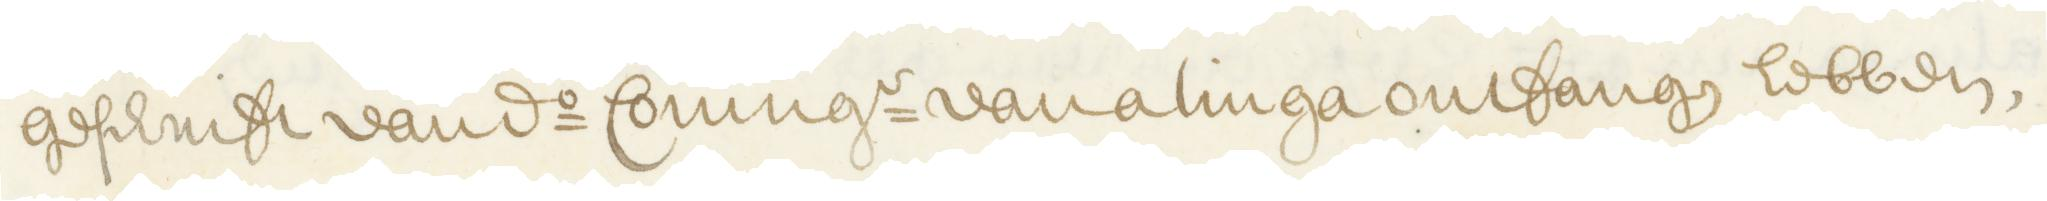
geschrift van d=o Coning=e van alinga ontfangen hebben,
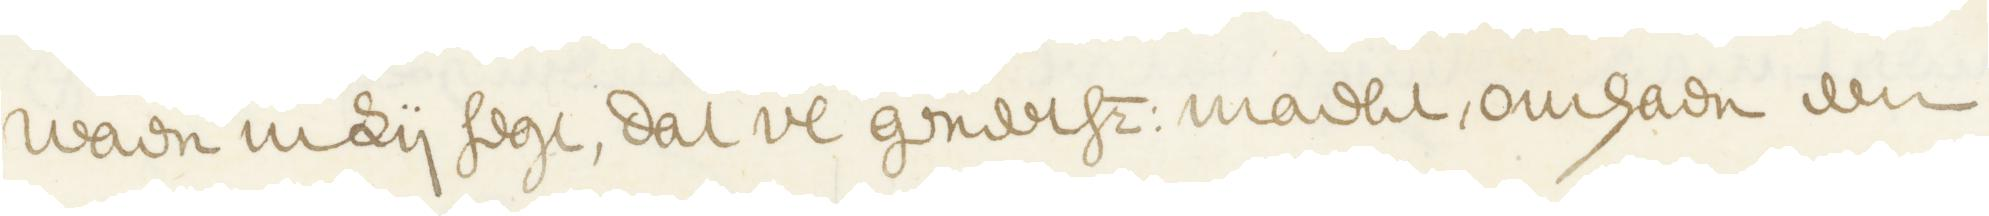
waer in zij segt, dat vl gereetsz: maekt, omhaer een
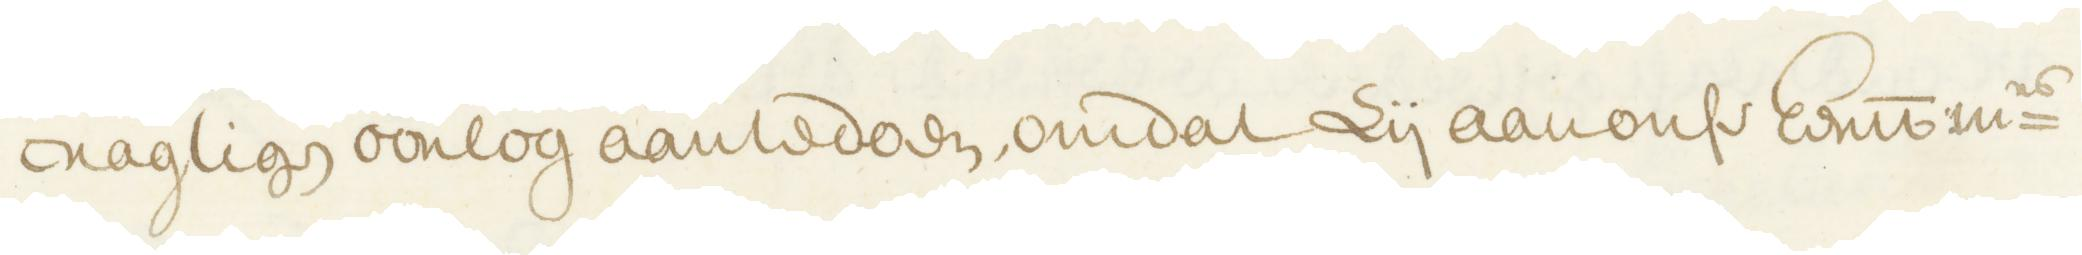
cragtigen oorlog aan te doen, omdat zij aan onse Eerw: m=rs
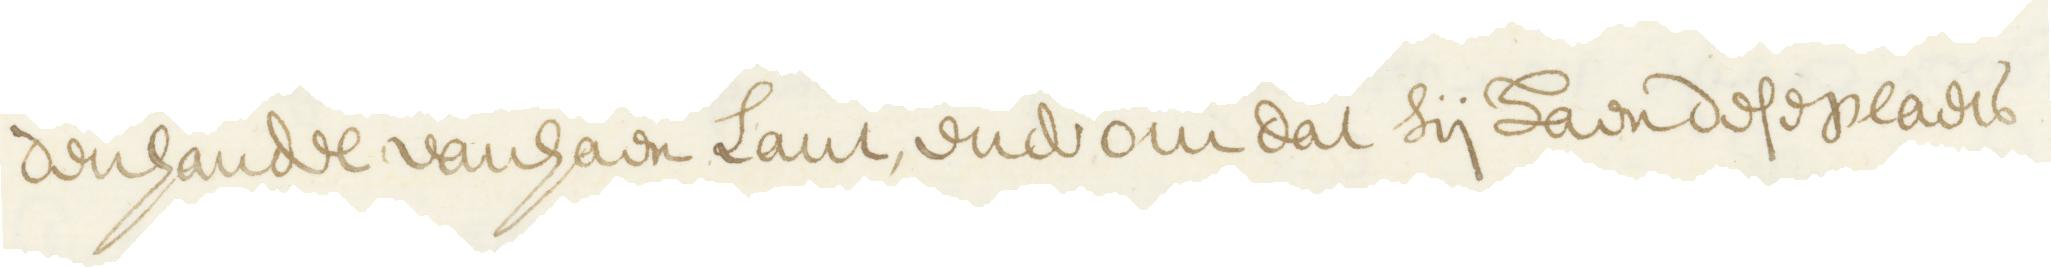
den handel van haer Lant, ende om dat sij haer dese plaets
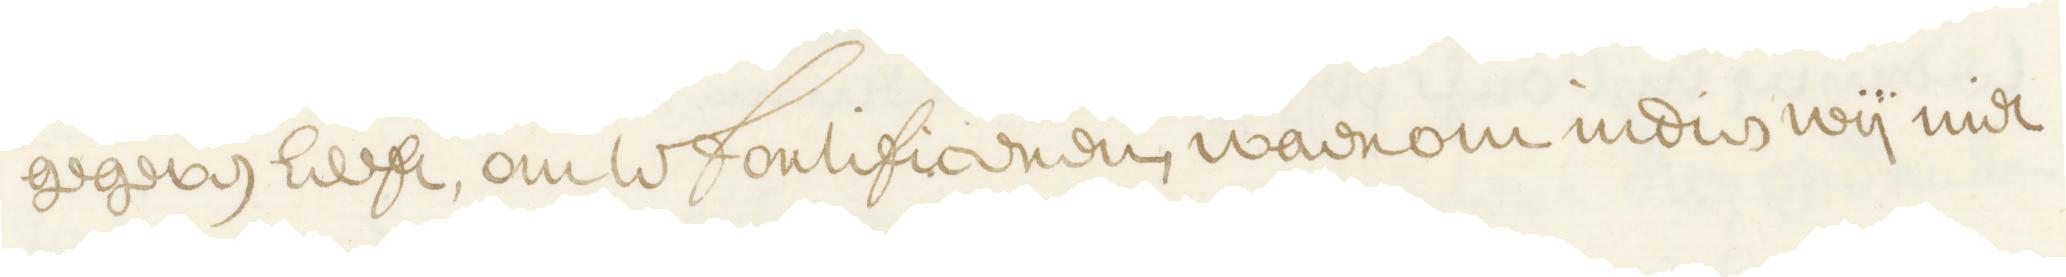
gegeven heeft, om te fortificeren, waerom indien wij niet
